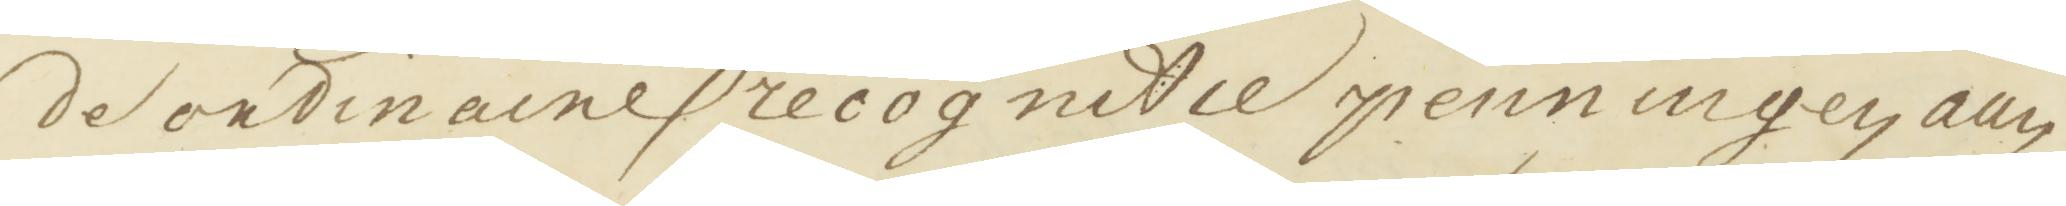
de ordinaire recognitie penningen aan
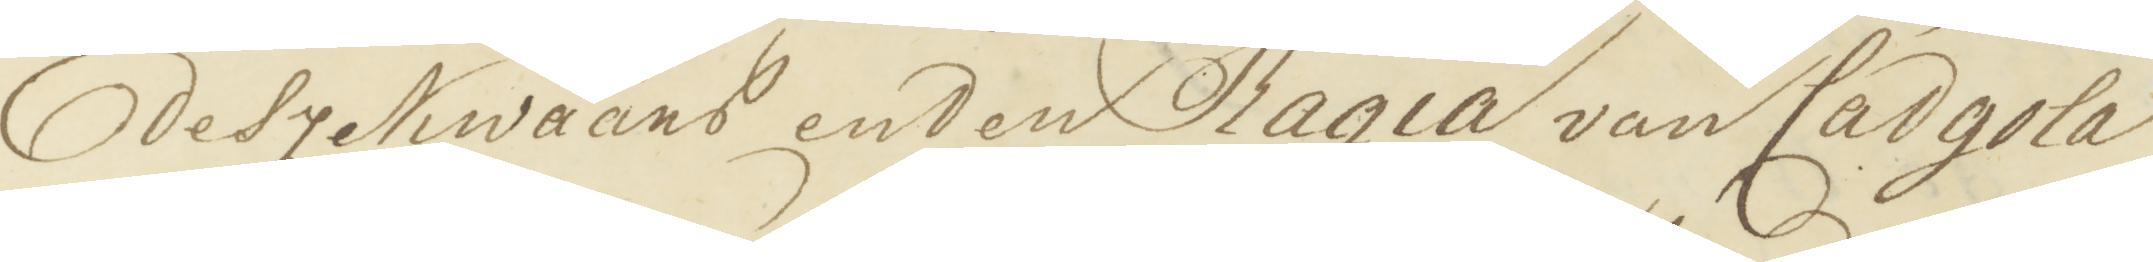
de sjekwaars en den Ragia van Cadgola
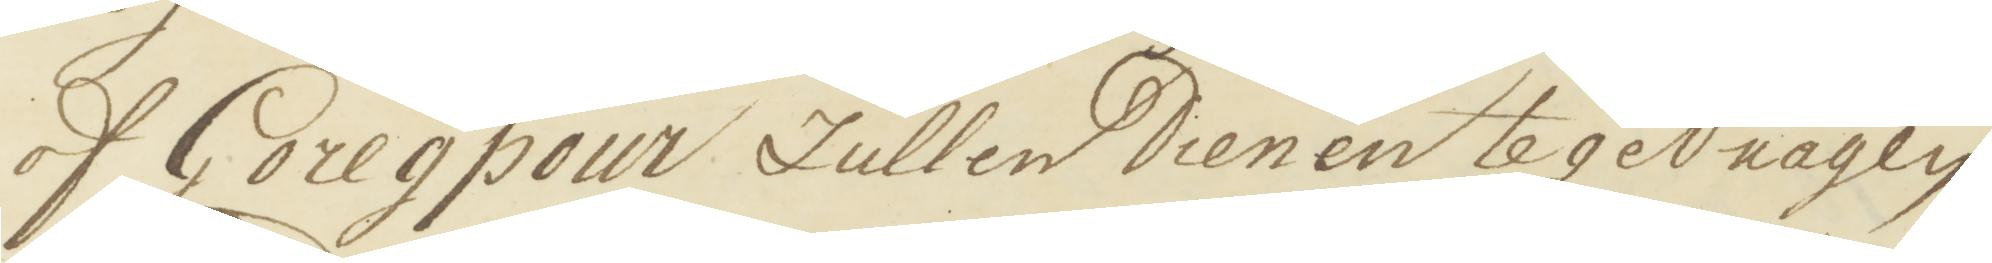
of Goregpour Zullen dienen te gedragen
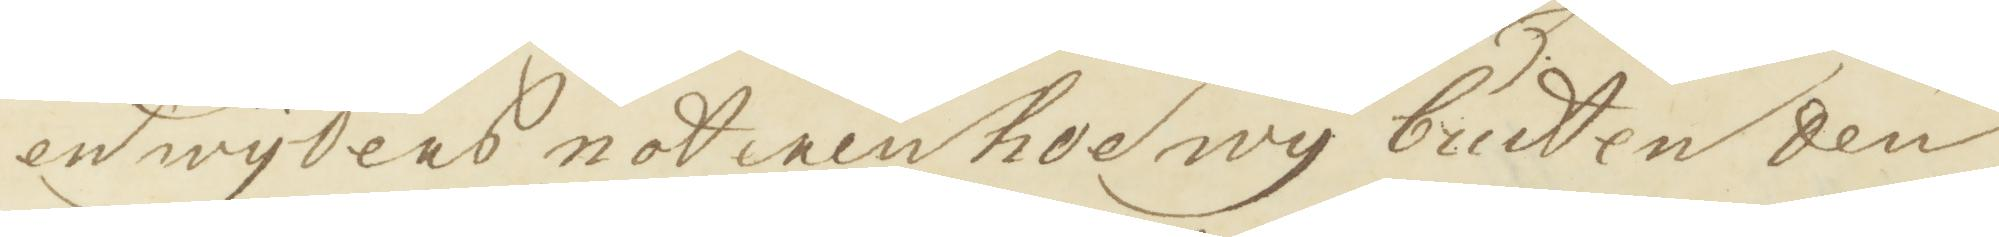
en wijders noteren hoe wij buiten den
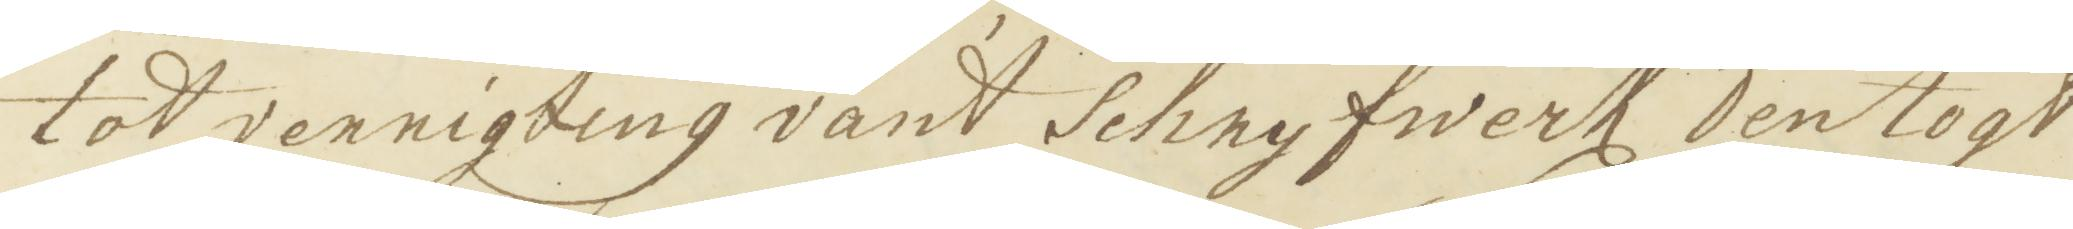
tot verrigting van’t schrijfwerk den togt
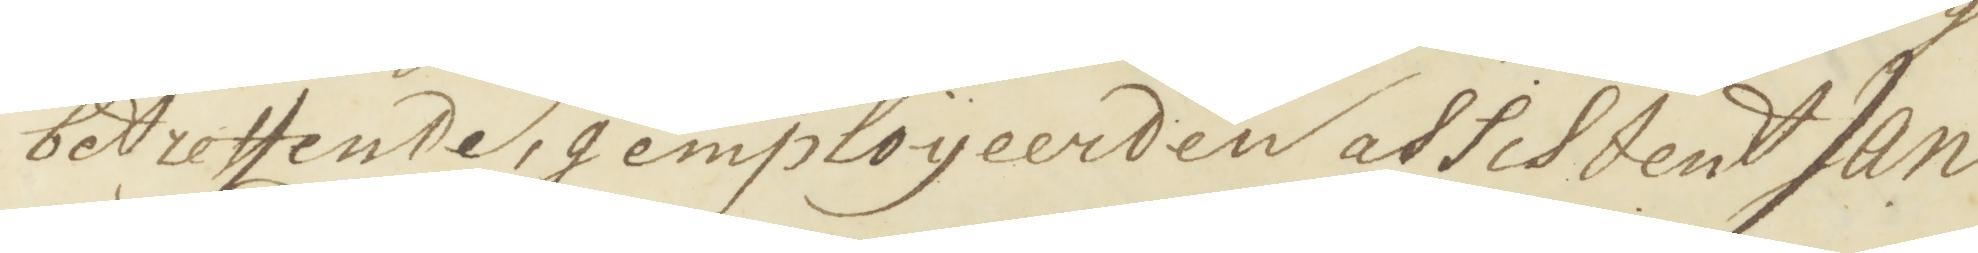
betreffende, g'emploijeerden assistent Jan
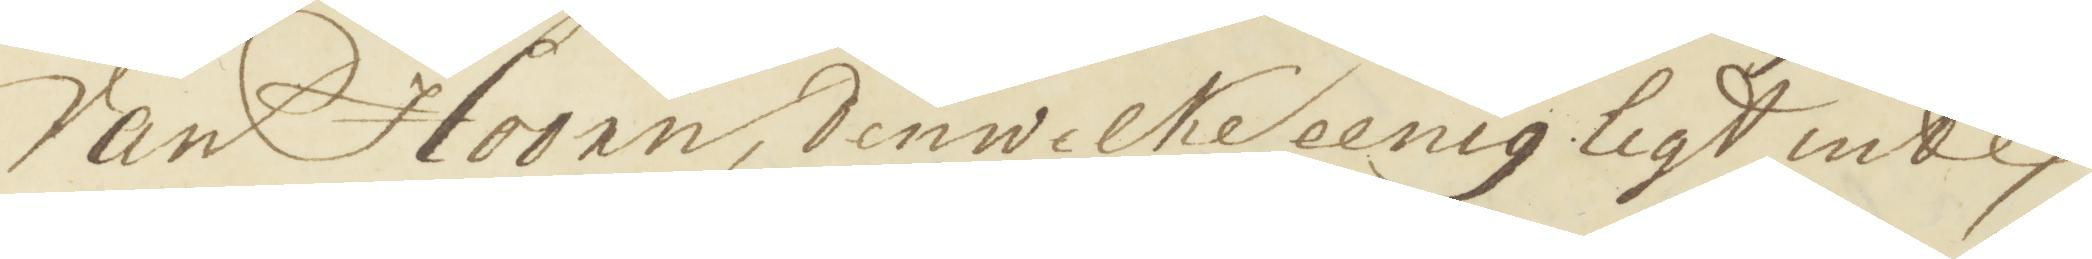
Van Hoorn, denwelke eenig ligt in de
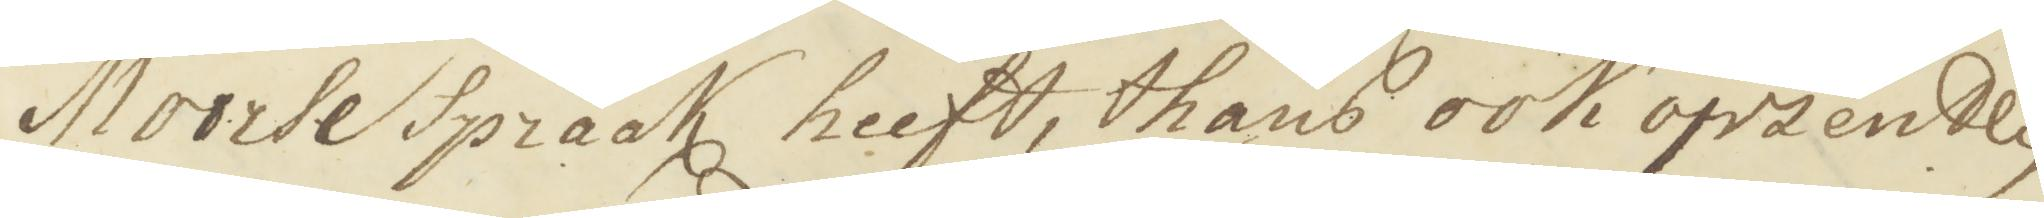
Moorse Spraak heeft, thans ook opzenden
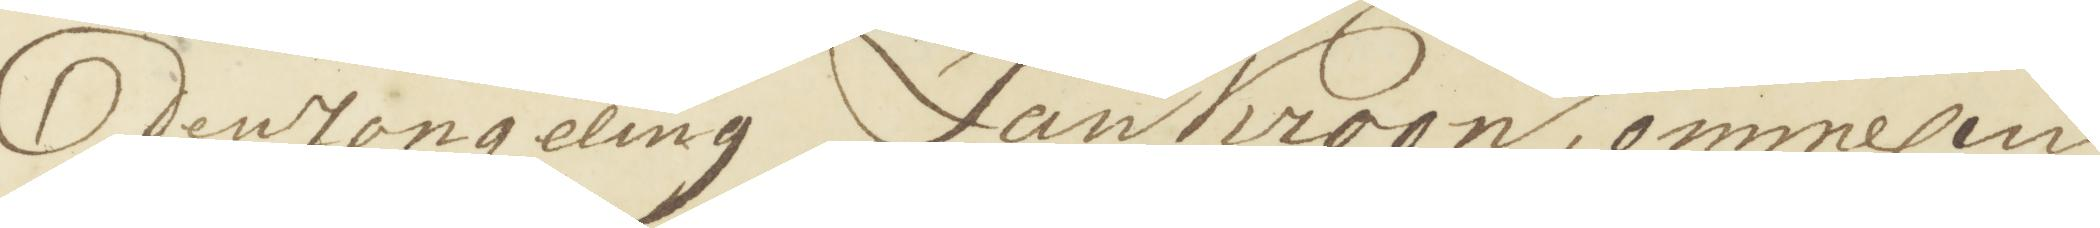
den Jongeling Jan Kroon, omme in
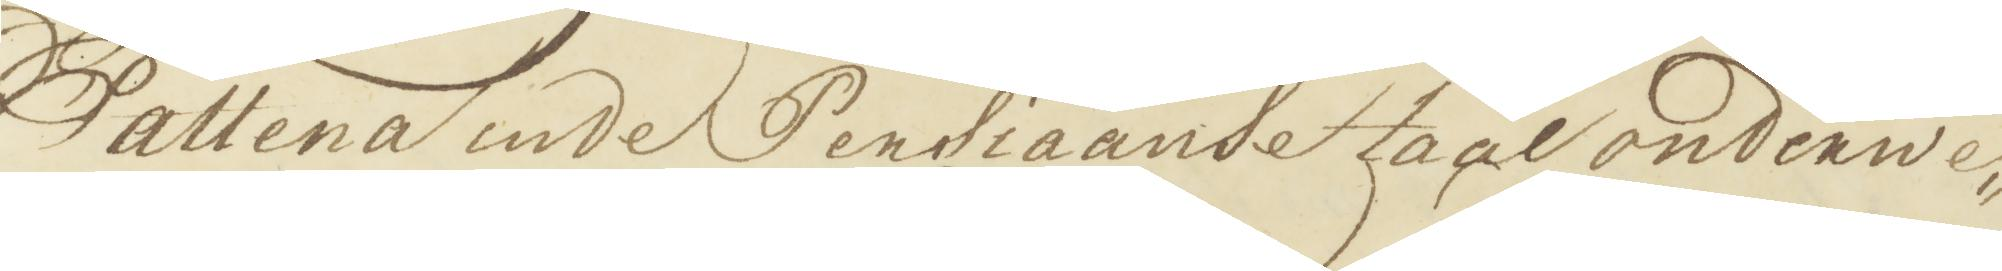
Pattena in de Persiaanse taal onderwe„
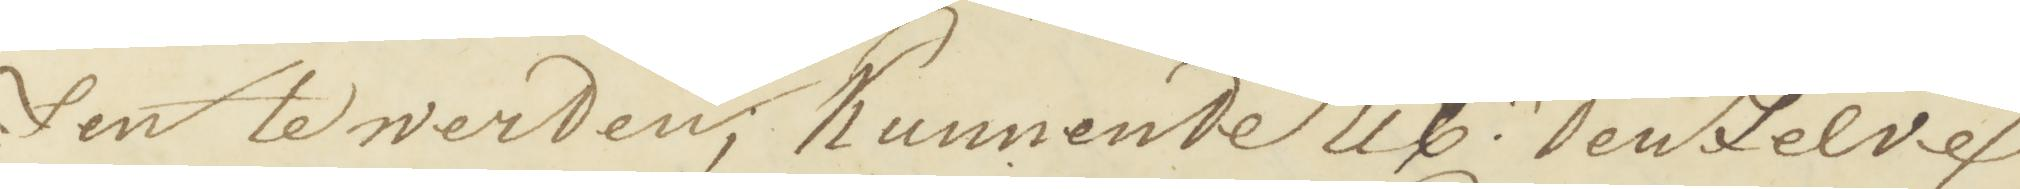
sen te werden, Kunnende UE: den Zelve
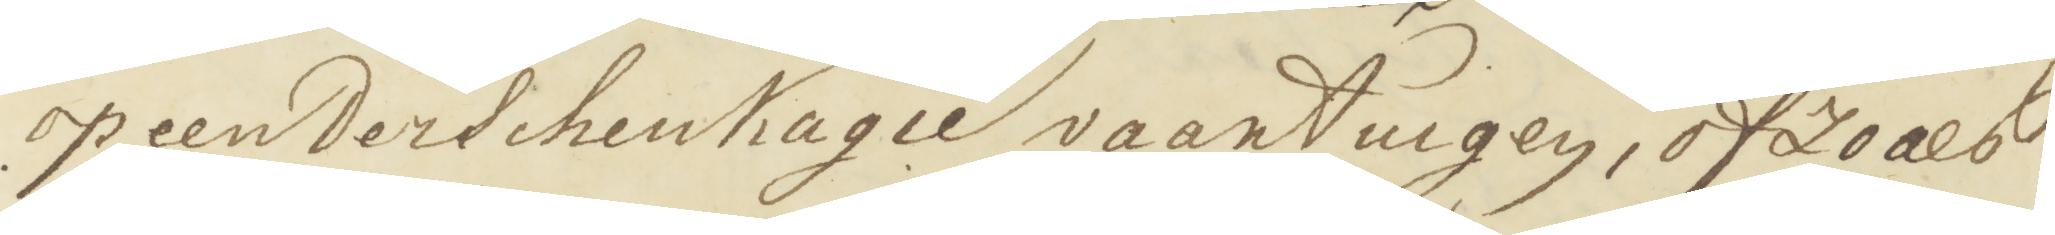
op een der Schenkagie vaartuigen, of Zoals
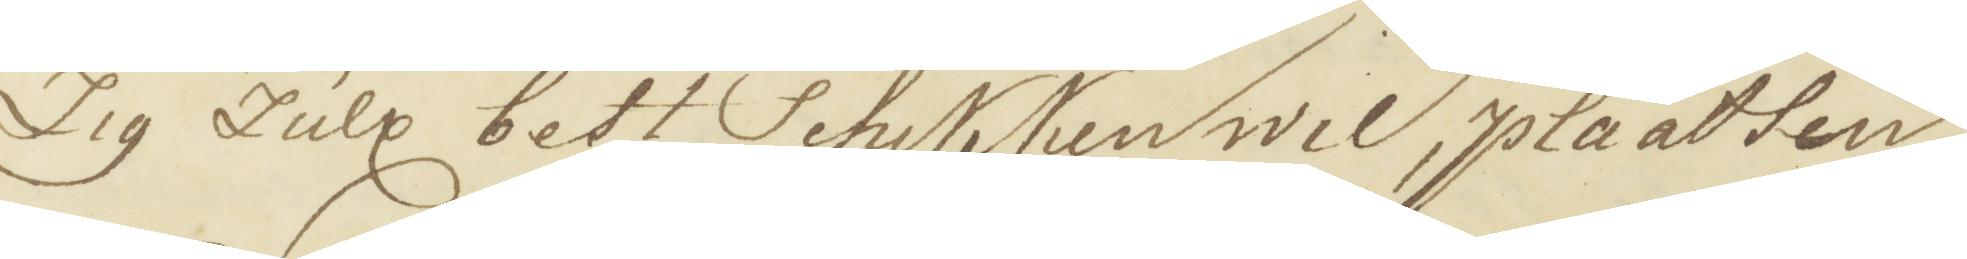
Zig Zulx best Schikken wil, plaatsen
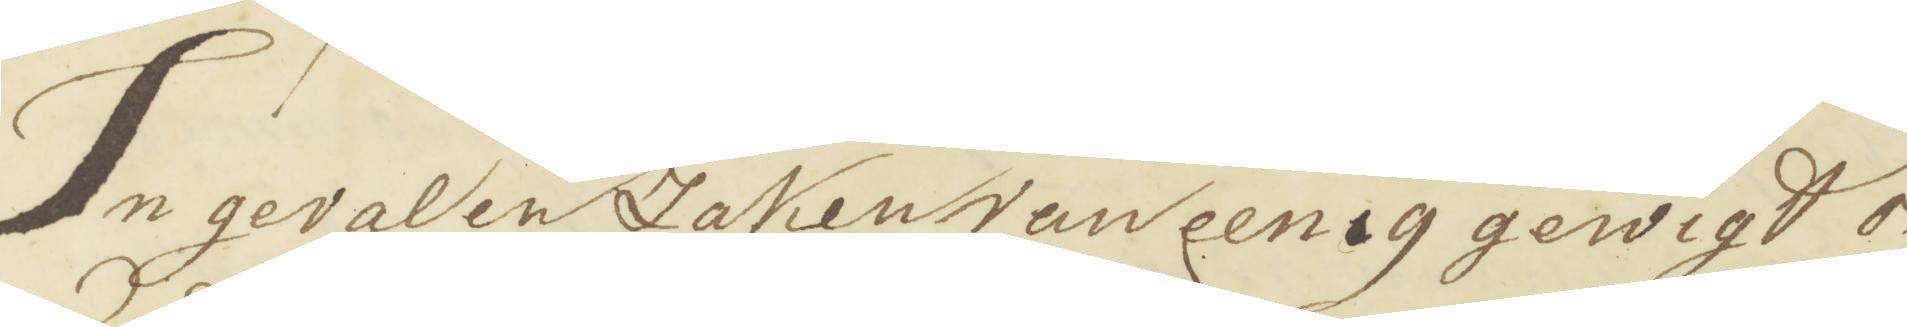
In geval er Zaken van eenig gewigt of
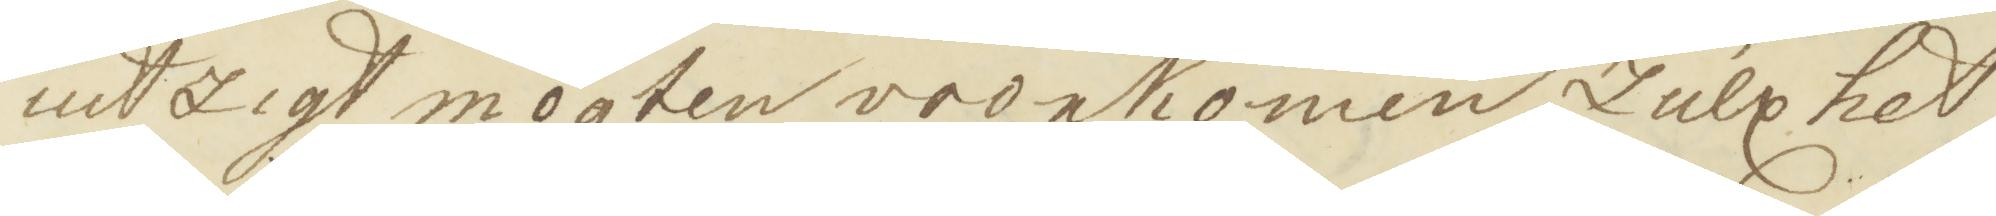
uittzigt mogten voorkomen Zulx het
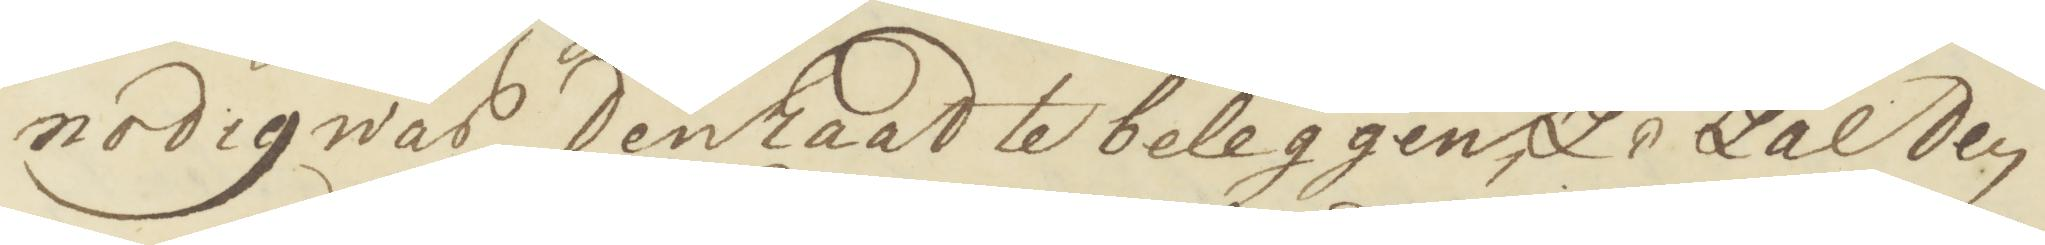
nodig was den raad te beleggen, Zo Zal den
